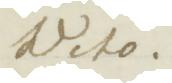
Dito. . . . . . . .
